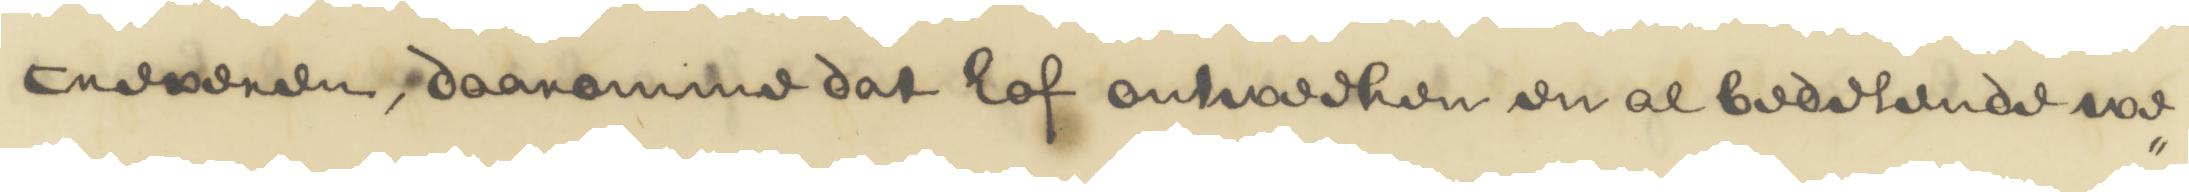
creveren, daar omme dat hof ontweeken en al bedelende we„
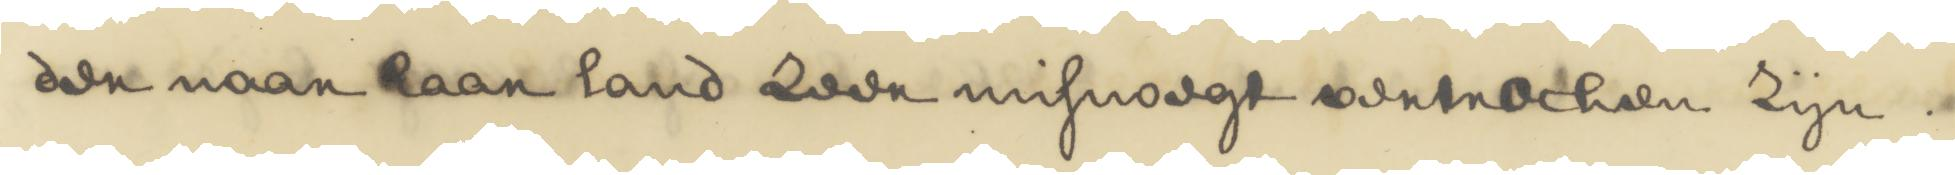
der naar haar land zeer misnoegt vertrocken zijn.
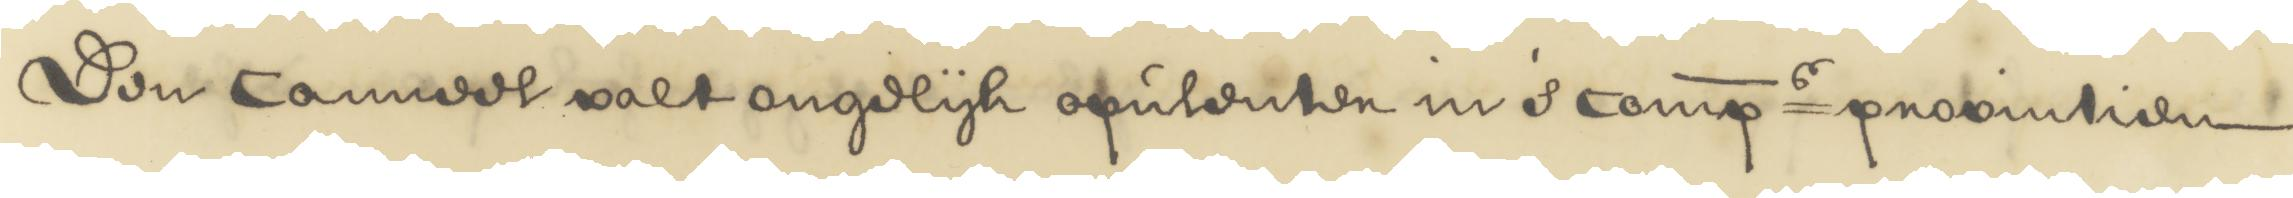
Den Canneel valt ongelijk opulenter in ’s comp=s provintien
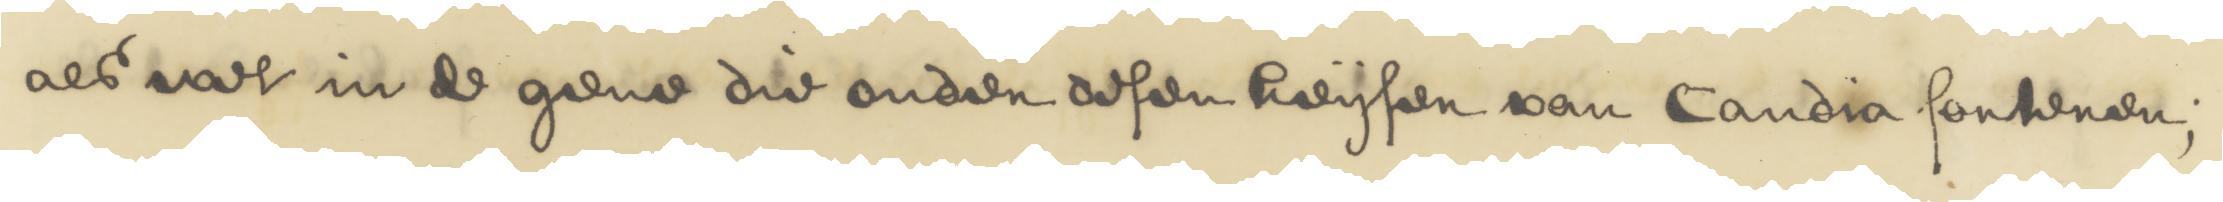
als wel in de gene die onder desen keijser van Candia sorteren;
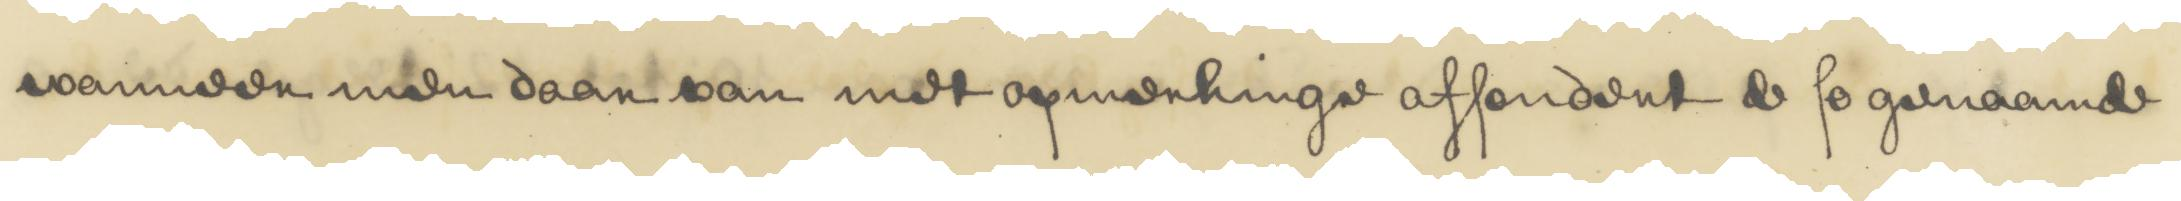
wanneer men daar van met opmerkinge afsondert de so genaamde
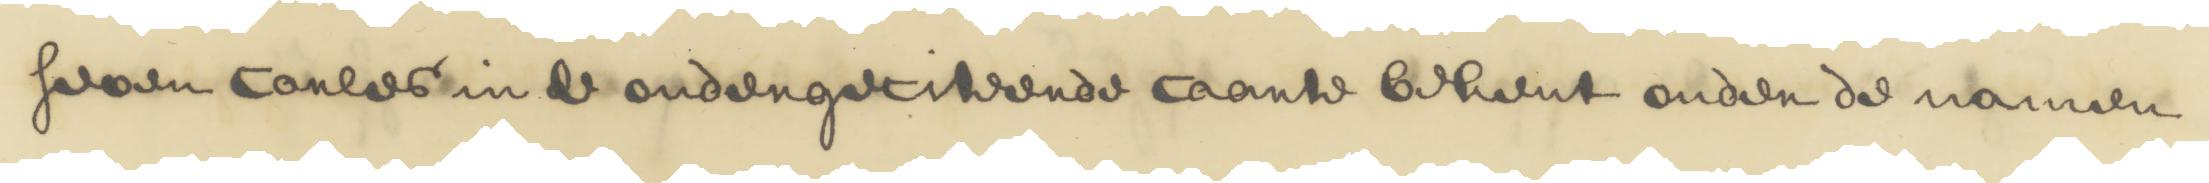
seven corles in de ondergeciteerde caarte bekent onder de namen
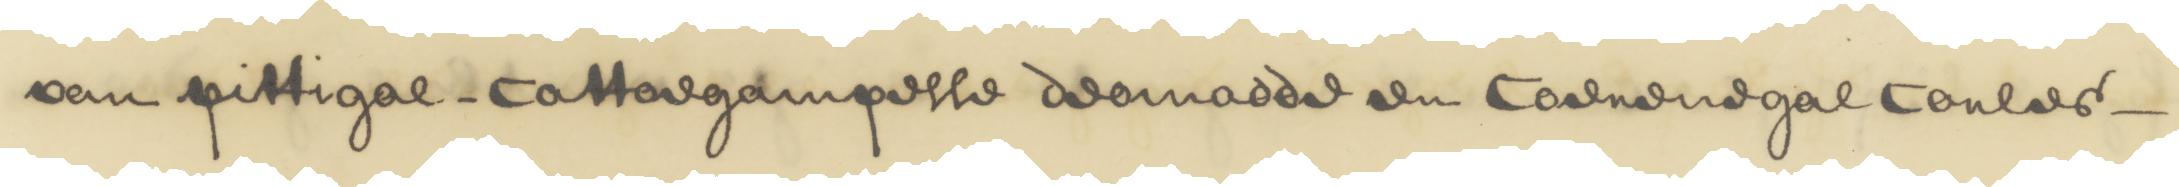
van pittigal-cattoegampelle deomadde en Coerenegal corles —
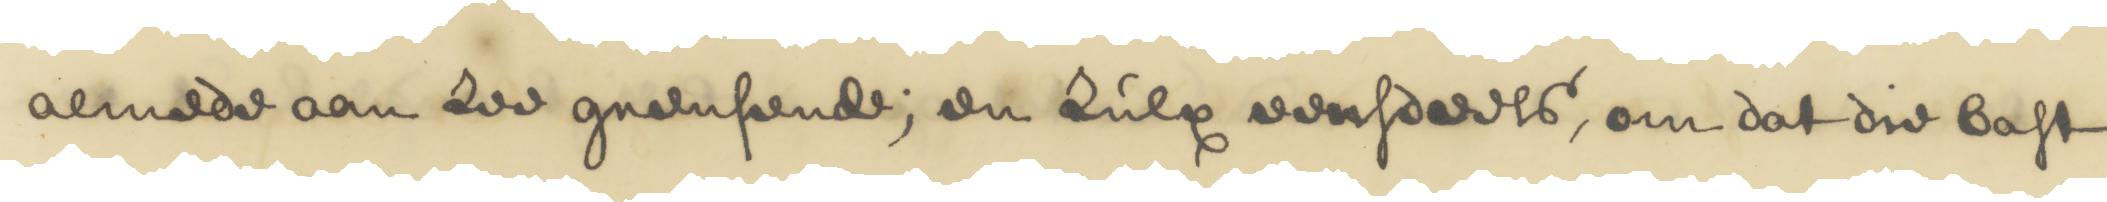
almede aan zee grensende; en zulx eensdeels, om dat die bast
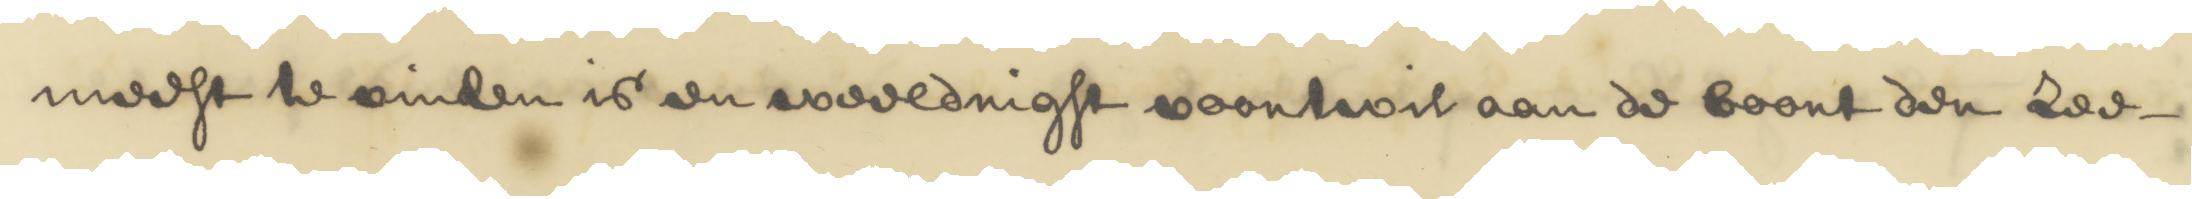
meest te vinden is en weeldrigst voortwil aan de boort der zee—
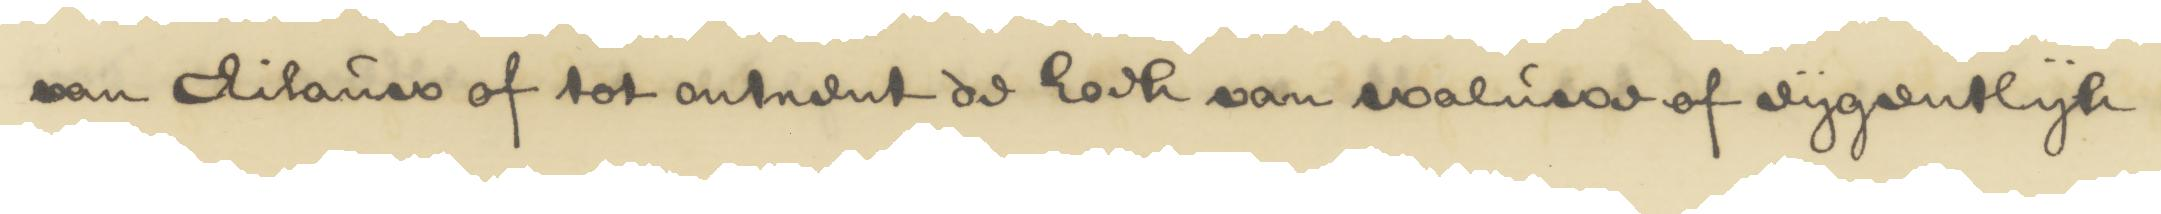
van chilauw of tot ontrent de hoek van waluwe of eijgentlijk
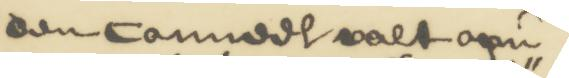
den canneel valt opu„
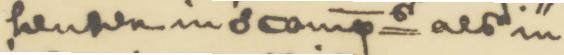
lenter in ’s comp=s als in
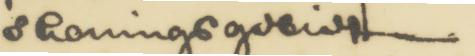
's konings gebiet
